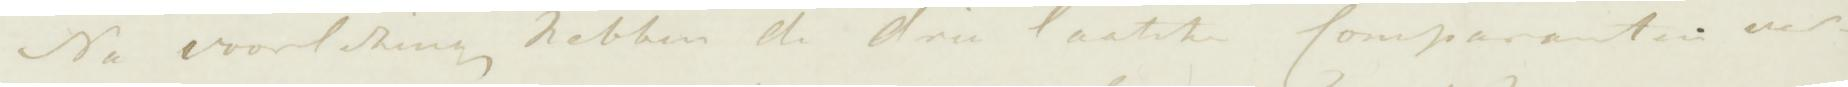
Na voorlezing hebben de drie laatste Comparanten ver„
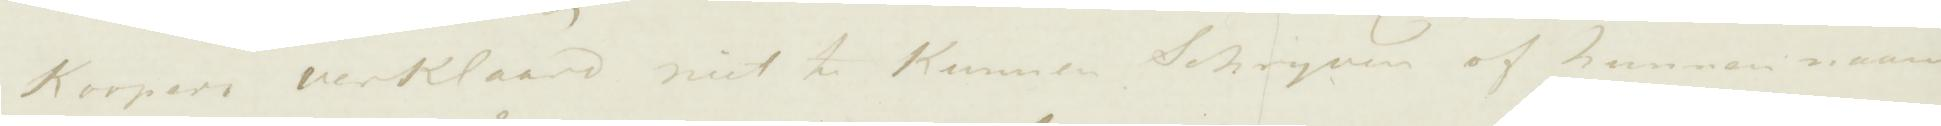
Koopers verklaard niet te kunnen Schrijven of hunnen naar
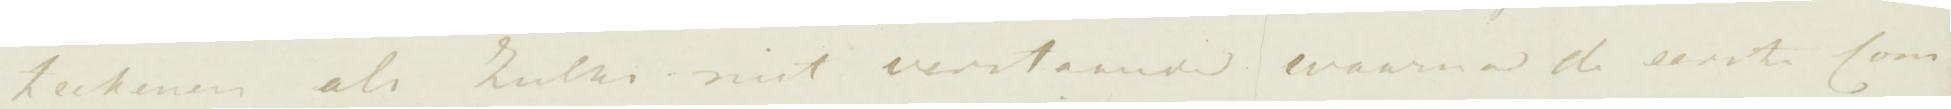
teekenen als Zulks niet verstaande: waarna de eerste Com
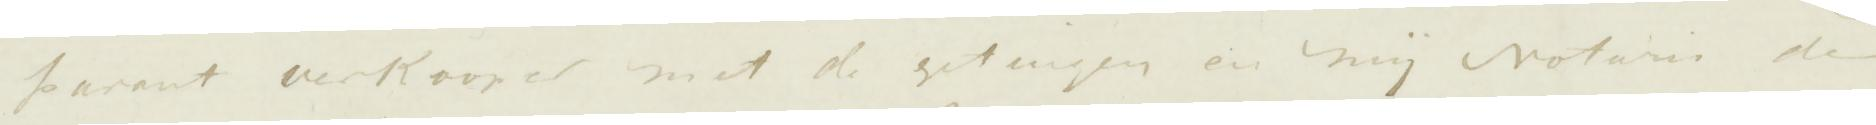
parant verkooper met de getuigen en mij Notaris de
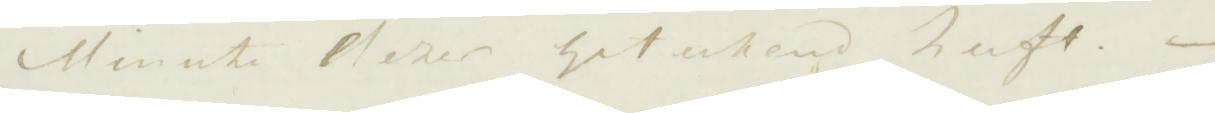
Minute dezer geteekend heeft.—
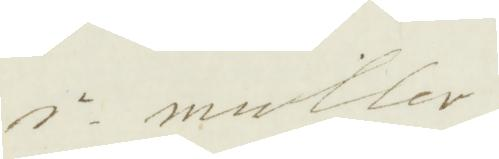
N:' muller
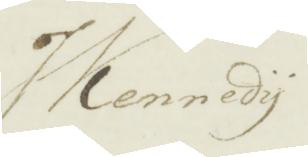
JKennedij
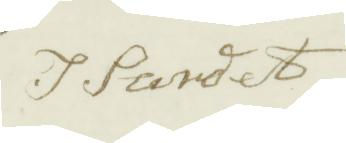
J Sardet
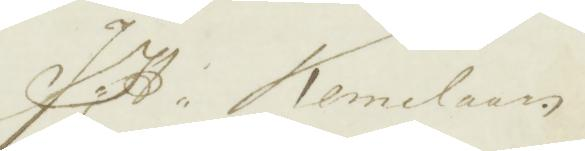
J H: Kemelaar
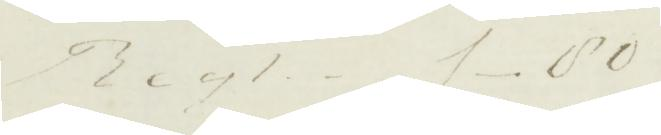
Regt.- ƒ .80
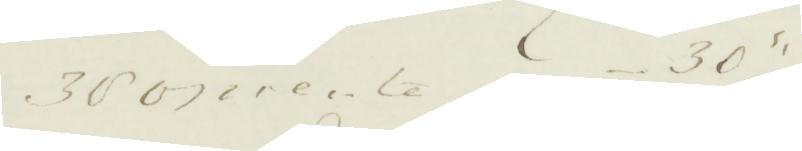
38 opcente — 30 ½
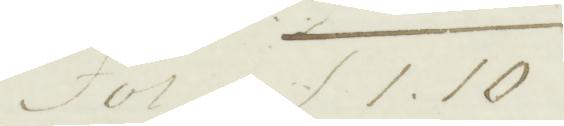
Tot ƒ1.10
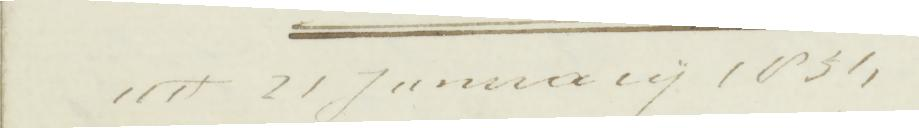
dd 21 Januarij 1854
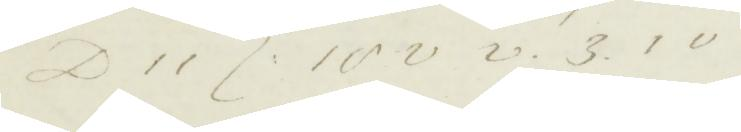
D eef: 18v v. 3. 10 ½
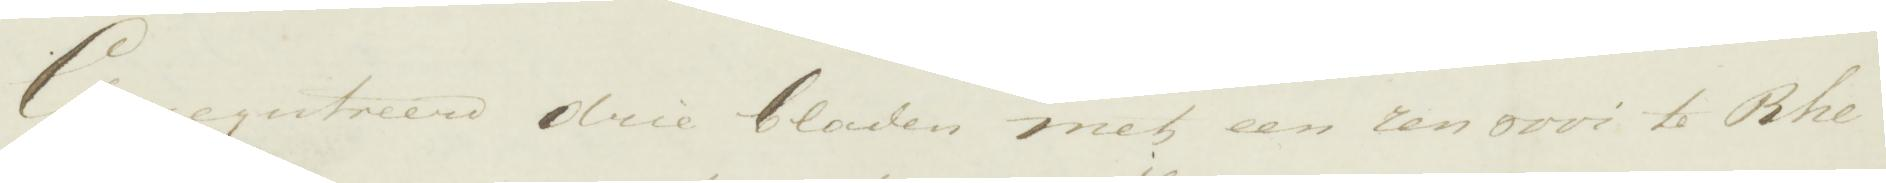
Geregistreerd drie bladen met een renvooi te Rhe
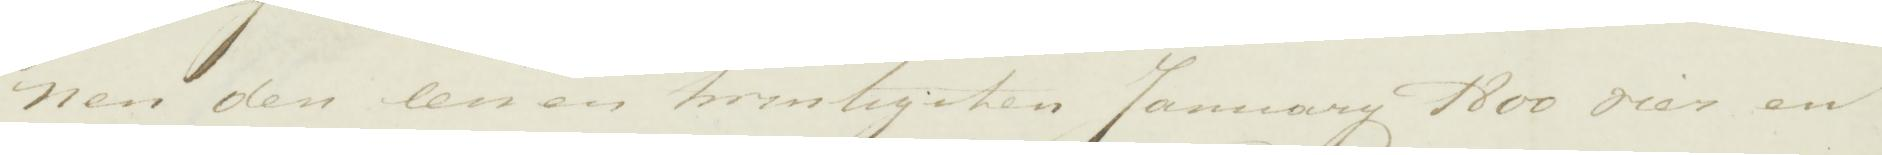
nen den een en twintigsten January 1800 vier en
